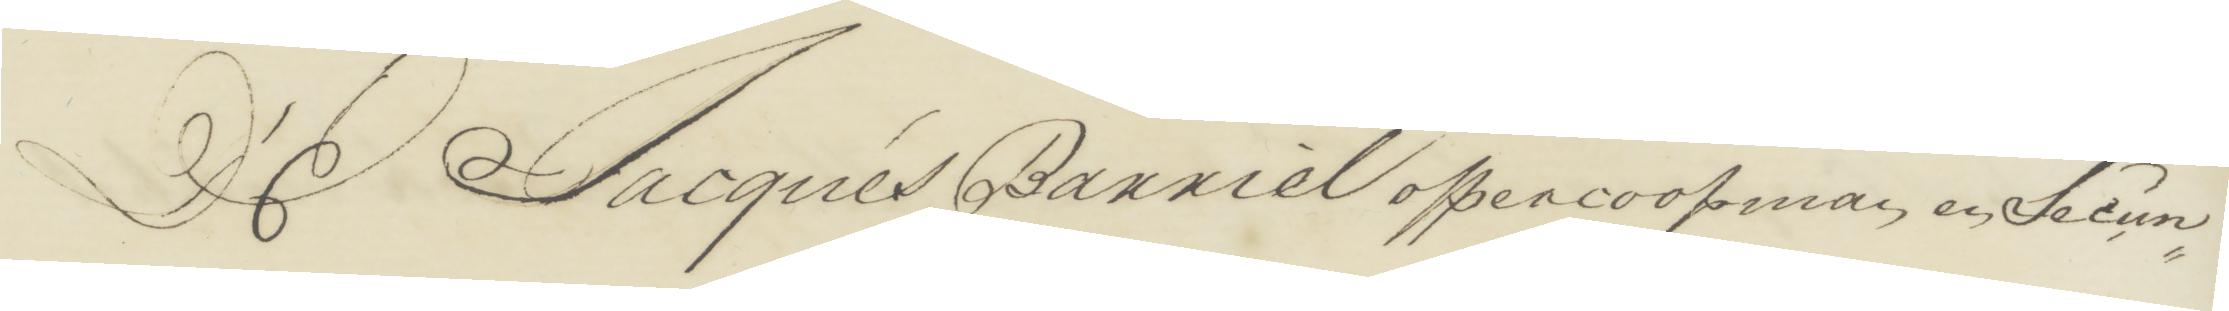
D'E Iacqués Barriel oppercoopman en Secun„
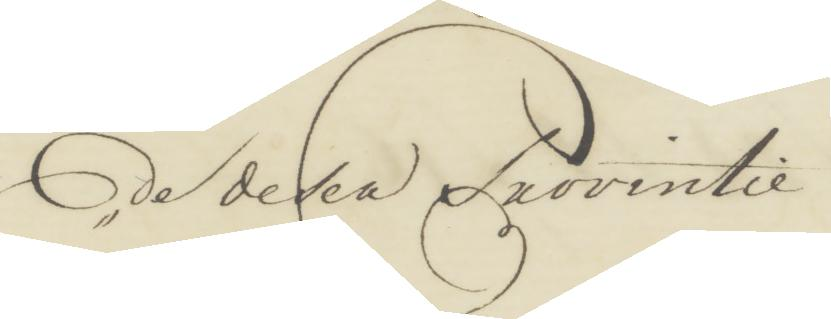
de deser Provintie
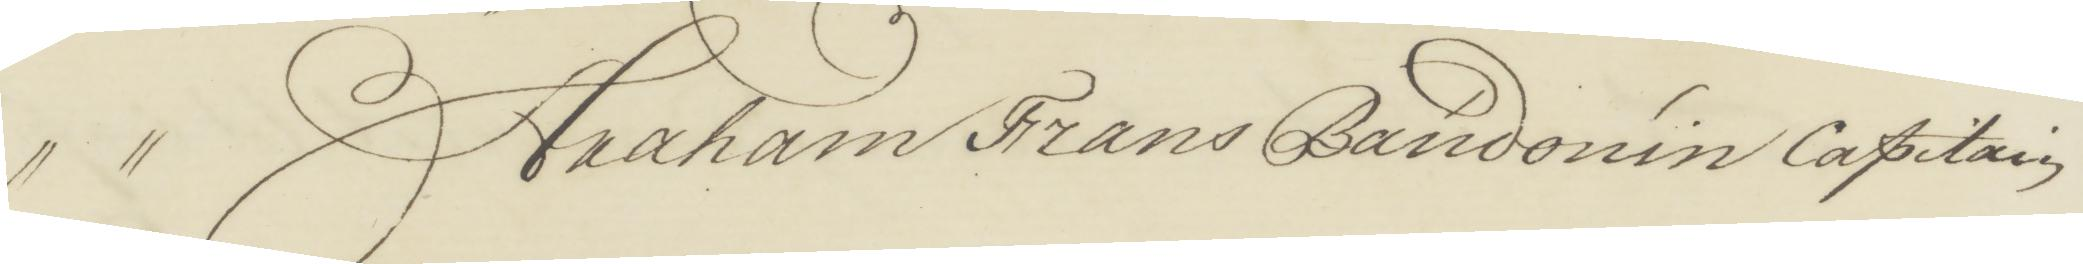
„ „ Araham Frans Baudouin Capitain
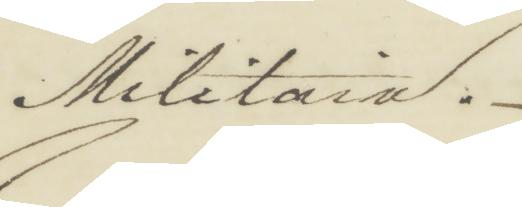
Militair. -
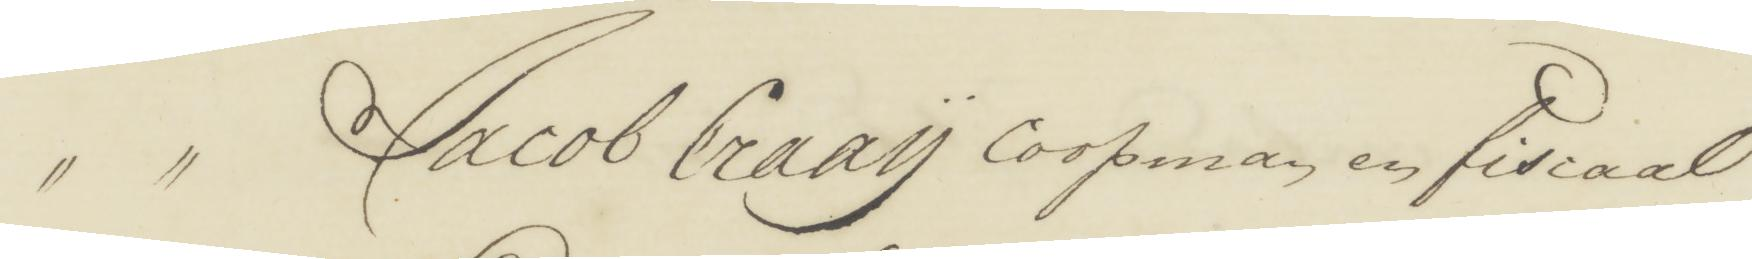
„ Iacob Craaij coopman en fiscaal
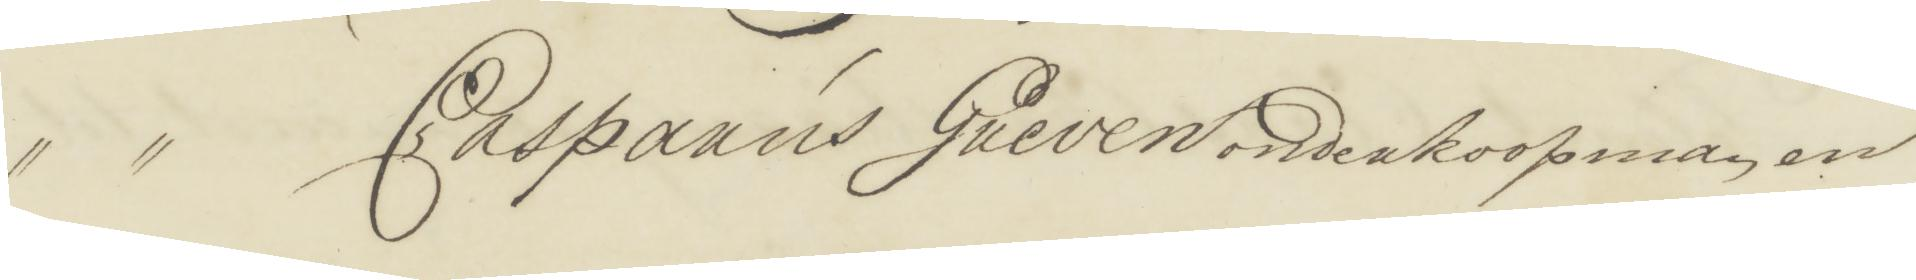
„ „ Casparus Greven onderkoopman en
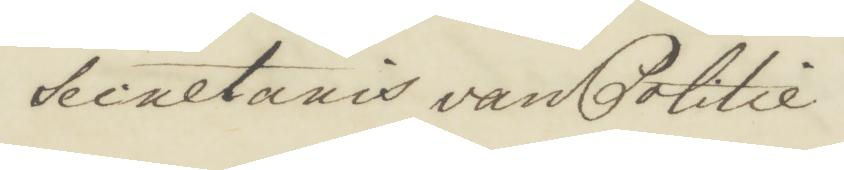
secretaris van Politie
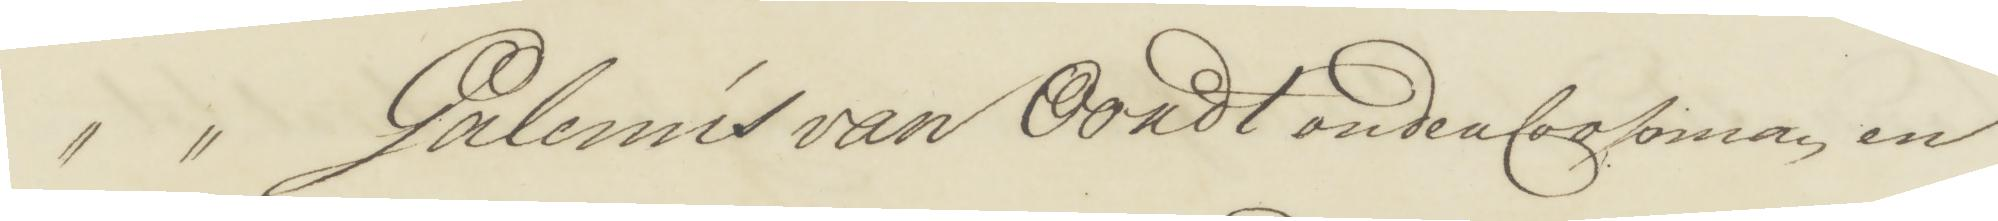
„ Galenus van Oordt onderCoopman en
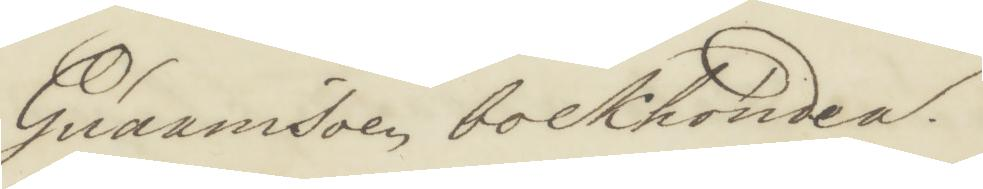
Guarnisoen boekhouder.
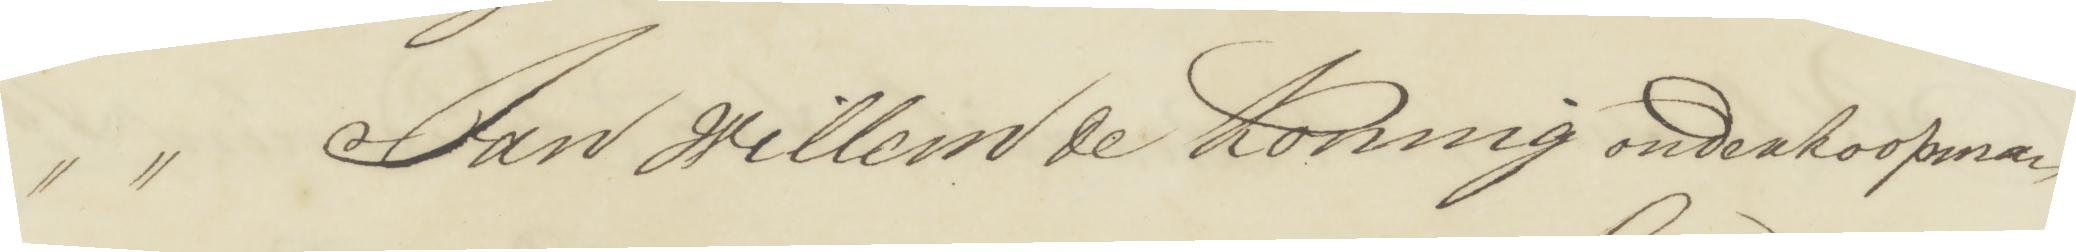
„ Ian Willem de Konnig onderkoopman
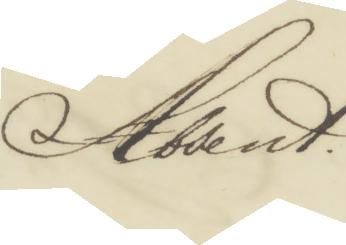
Absent.
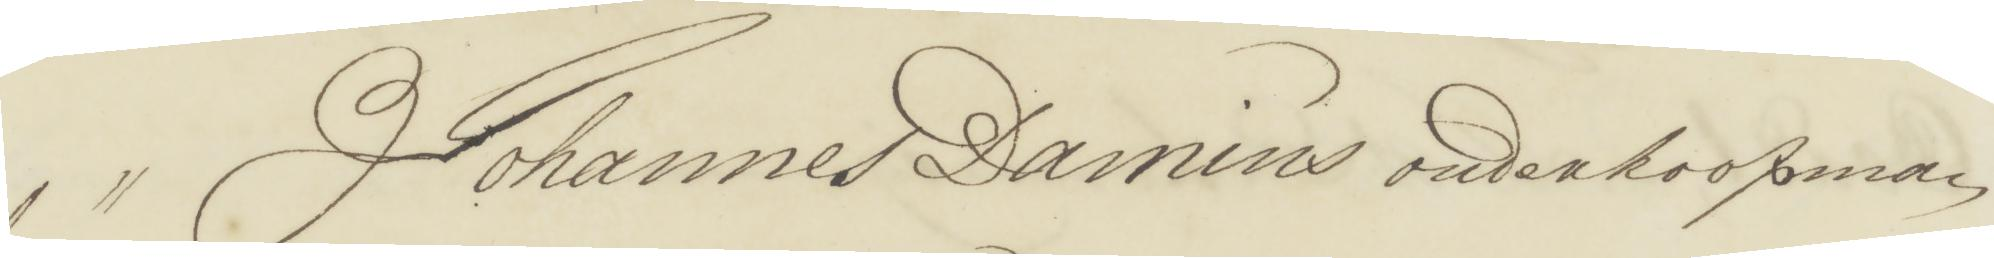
„ „ Johannes Damius onderkoopman
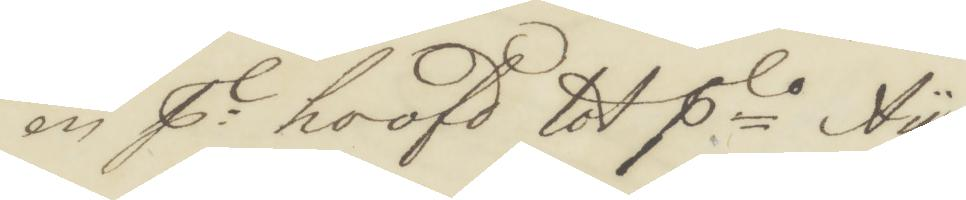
en p:l hoofd tot p=lo Aij
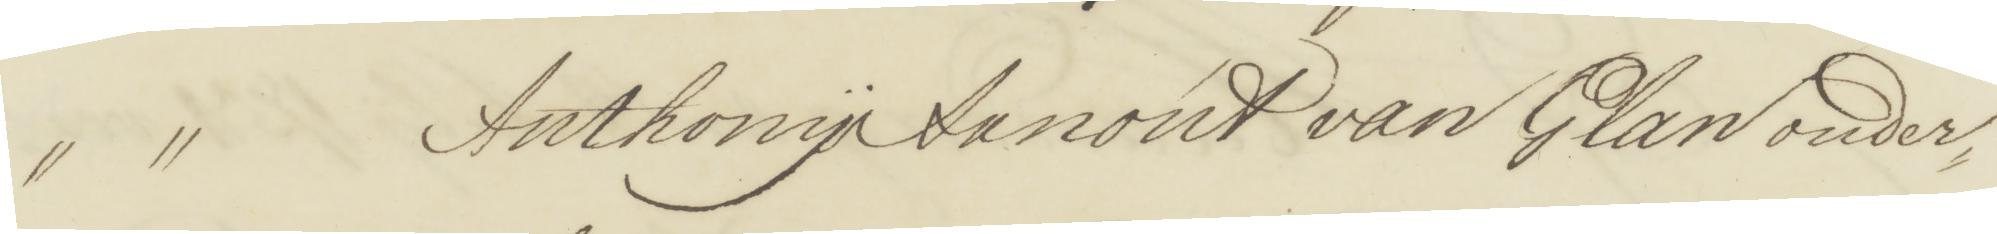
„ „ Anthonij Arnout van Glan onder„
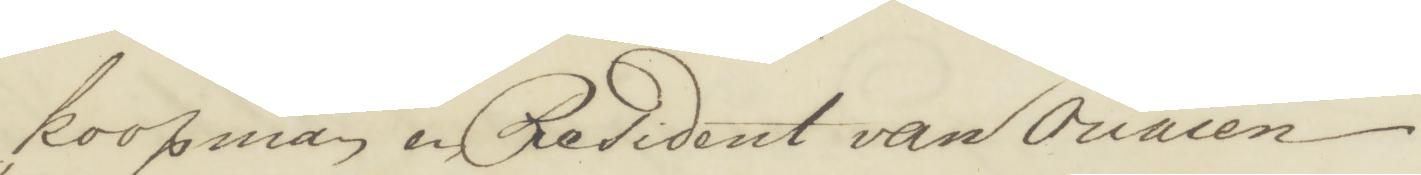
koopman en Resident van Ourien
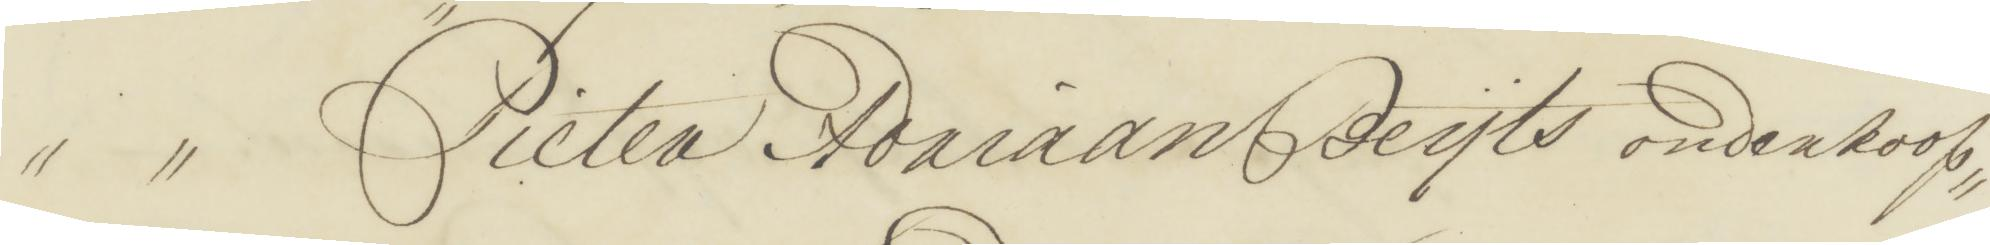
„ „ Pieter Adriaan Beijts onderkoop„
